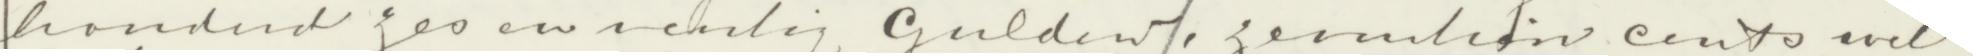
honderd zes en veertig Gulden/, zeventien cents, wel
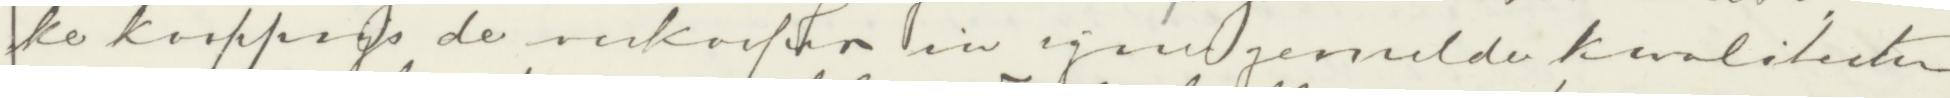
ke koopprijs de verkooper in zijn gemelde kwaliteiten
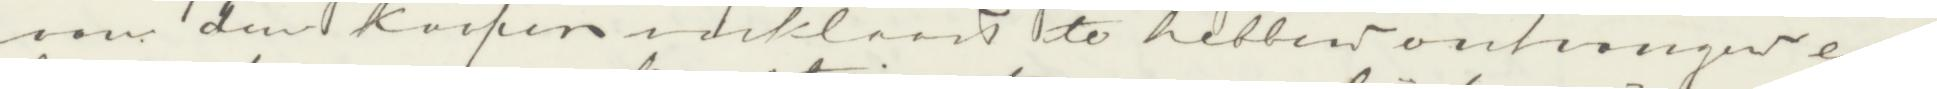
van den kooper verklaard te hebben ontvangen en
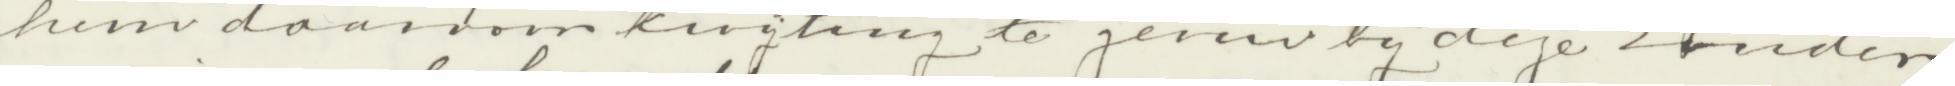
hem daarvoor kwijting te geven bij deze zonder
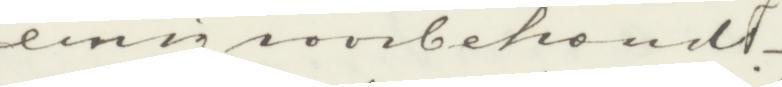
eenig voorbehoud.-
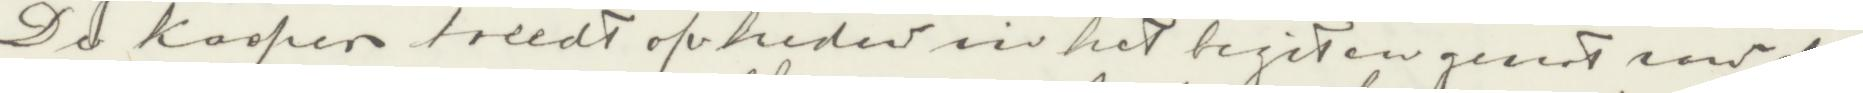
De kooper treedt op heden in het bezit en genot van de
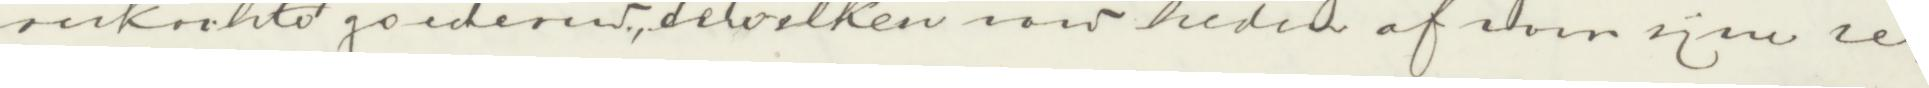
verkochte goederen, dewelken van heden of voor zijne re
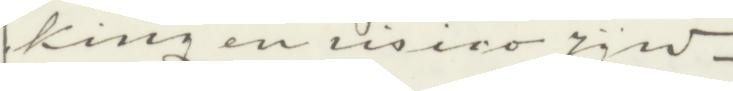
king en risico zijn-
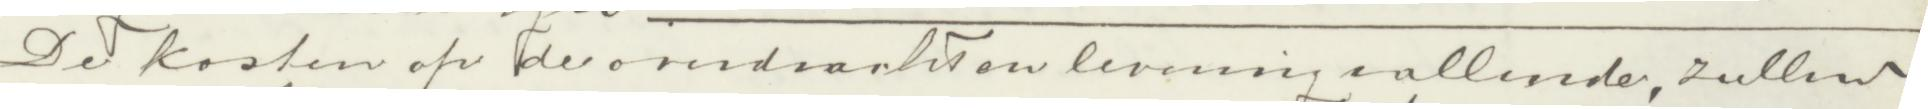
De kosten op de overdracht en levering vallende, zullen
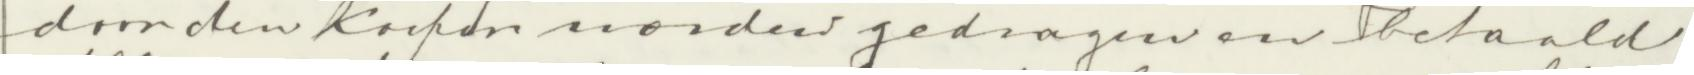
door den kooper worden gedragen en betaald
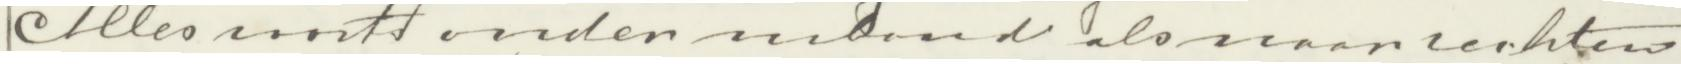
Ales voorts onder verband als naar rechten
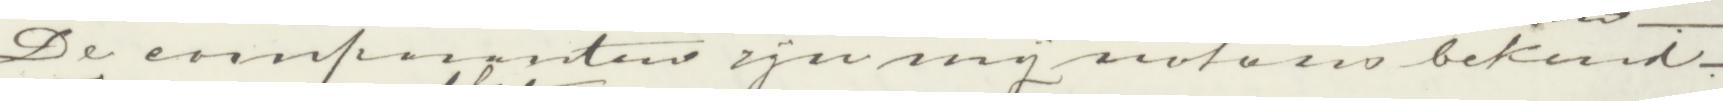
De comparanten zijn mij notaris bekend-
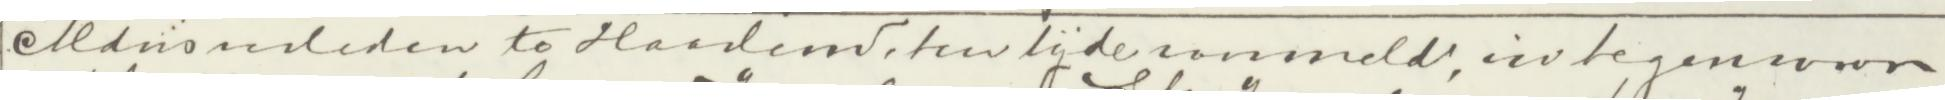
Aldus verleden te Haarlem ten tijde voormeld, in tegenwoor
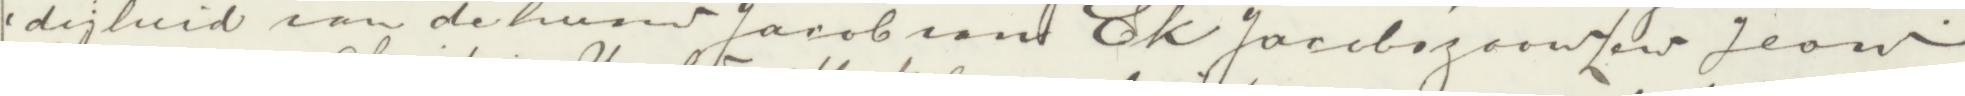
„digheid van de heren Jacob van Ek Jacobzsoon¶ en Jean
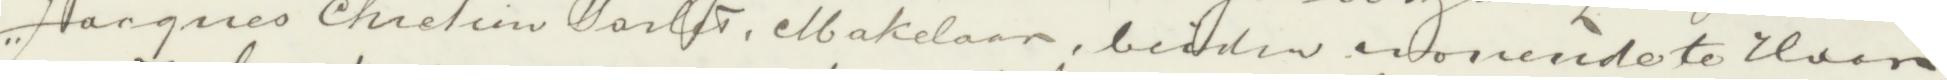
„Jacques Chrétien Sarlet, Makelaar, beiden wonende te Haar
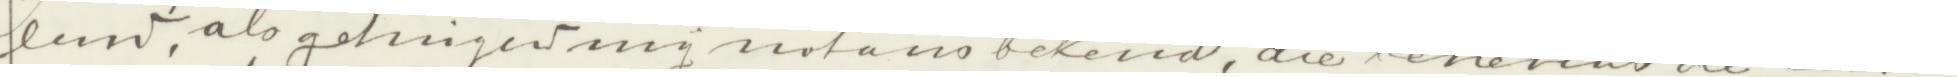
lem, als getuigen mij notaris bekend, die benevens de com„
